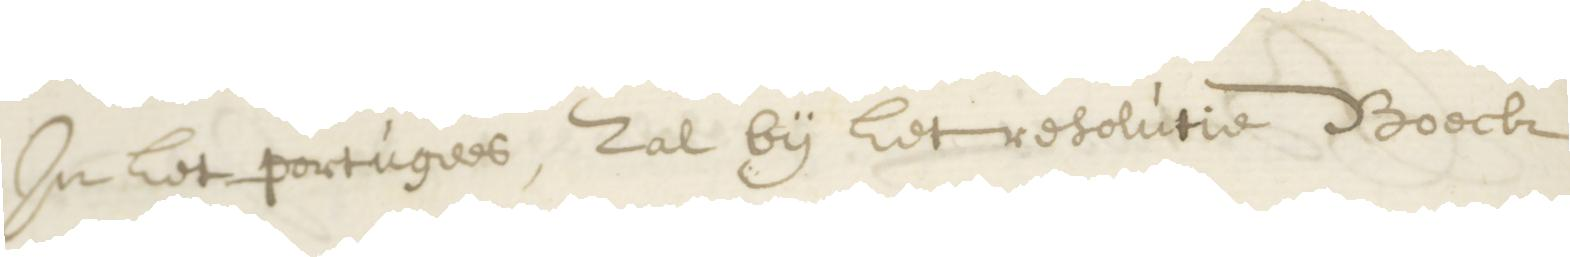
In het portugees, zal bij het resolutie Boeck
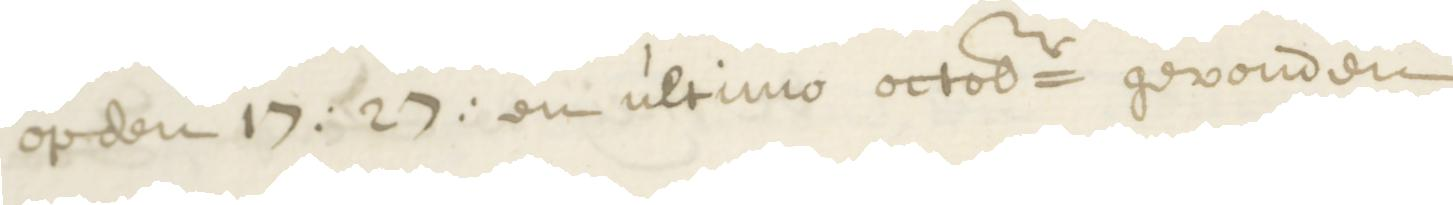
op den 17: 27: en ultimo octob=r gevonden
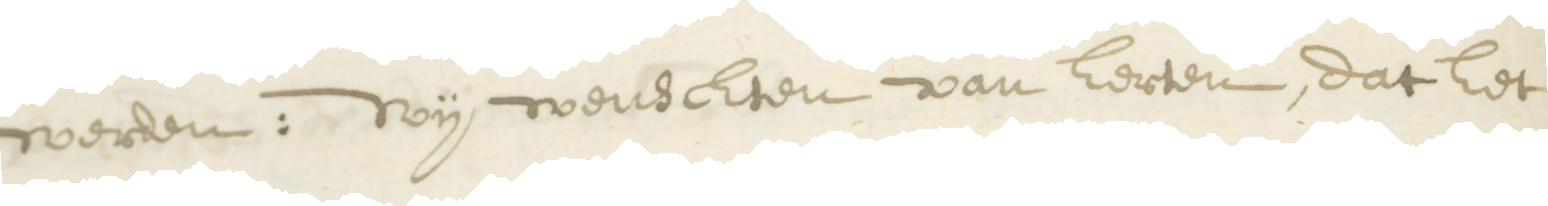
werden: wij wenschten van herten, dat het
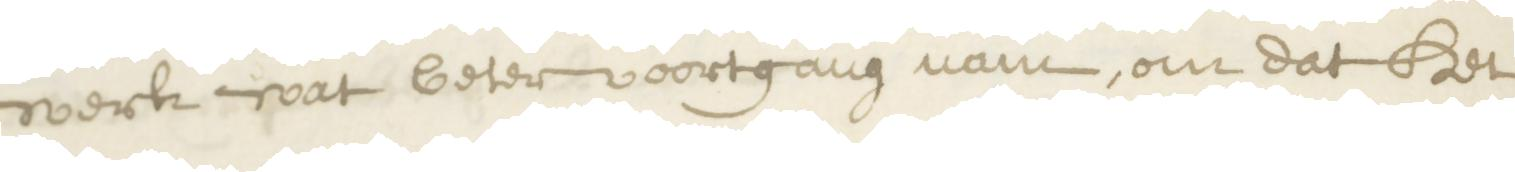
werk wat beter voortgang nam, om dat het
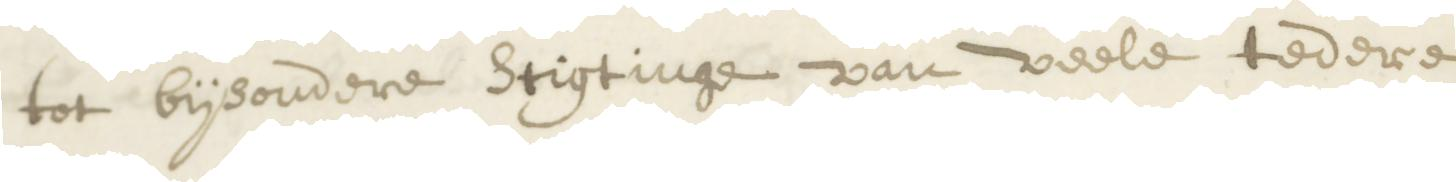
tot bijsondere stigtinge van veele tedere
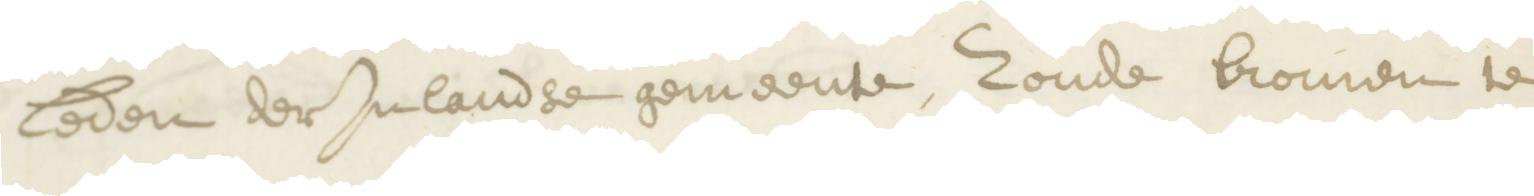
leden der inlandse gemeente, zoude komen te
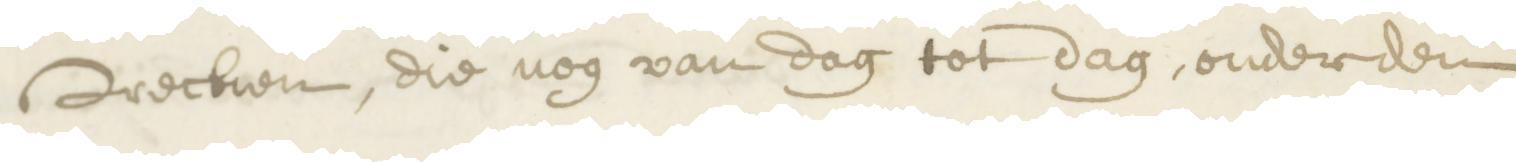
strecken, die nog van dag tot dag, onder den
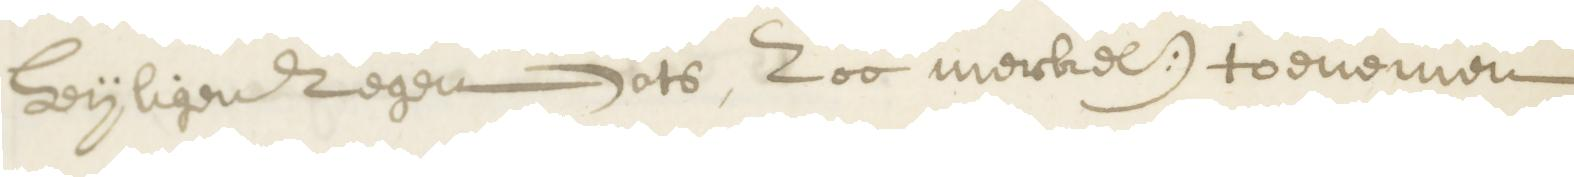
Heijligen zegen Gots, zoo merkelijk toenemen
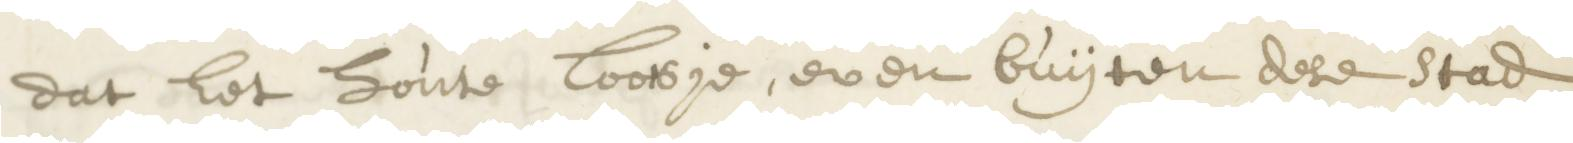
dat het houte lootsje, even buijten dese stad
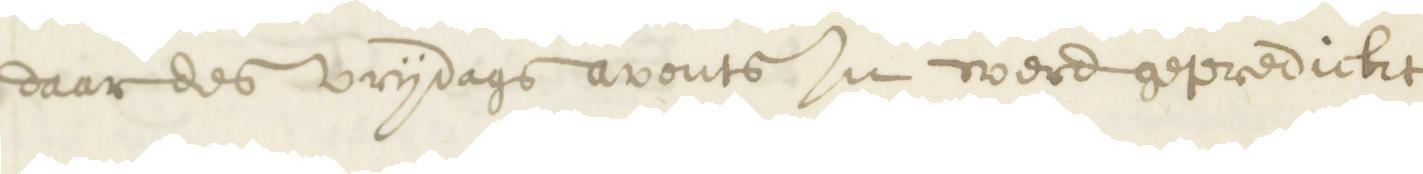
daar des vrijdags avonts in werd gepredickt
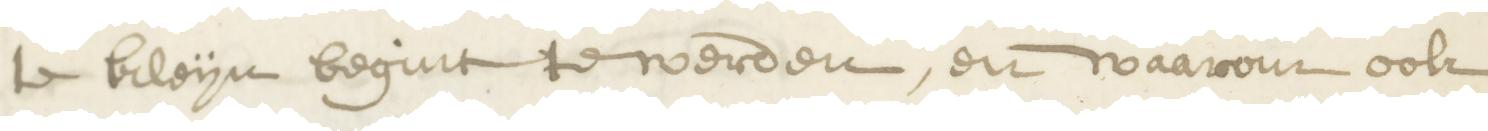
te kleijn begint te werden, en waarom ook
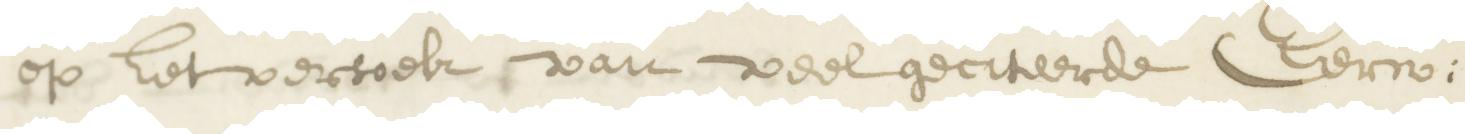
op het versoek van veel geciteerde Eerw:
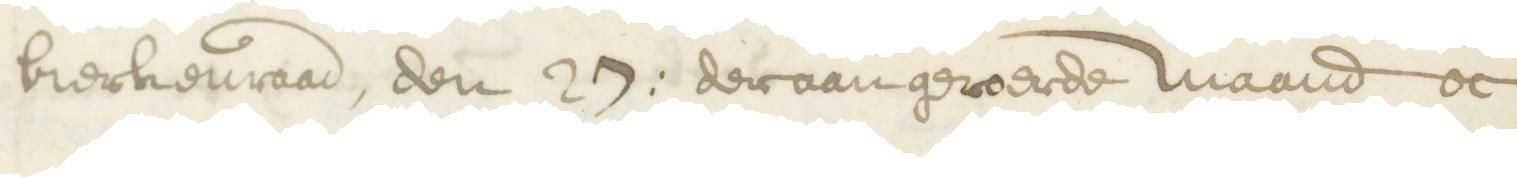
kerkenraad, den 27: der aan geroerde maand oc
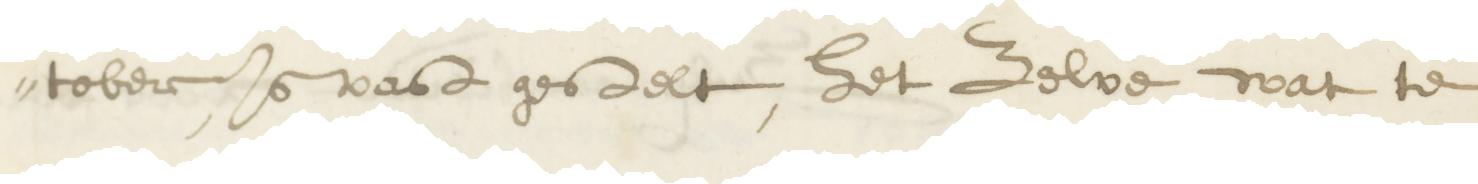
„tober is vast gesdelt, het zelve wat te
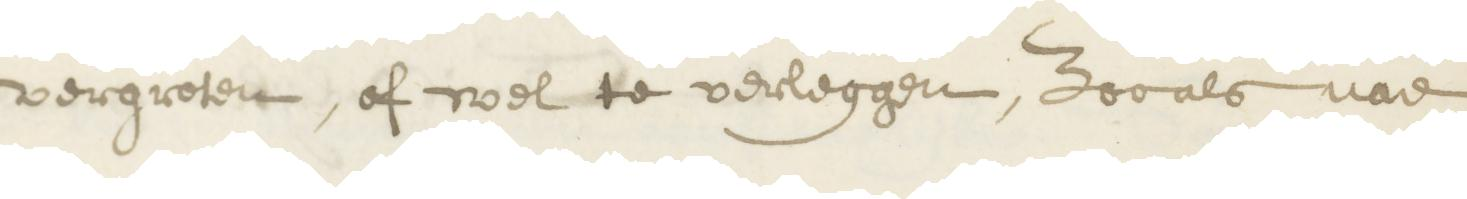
vergroten, of wel te verleggen, zooals nae
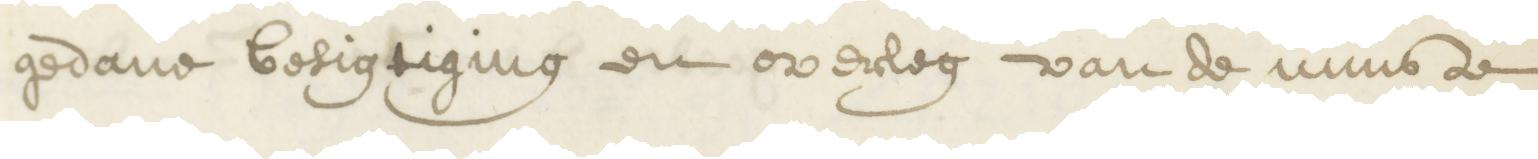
gedane besigtiging en overleg van de minste
